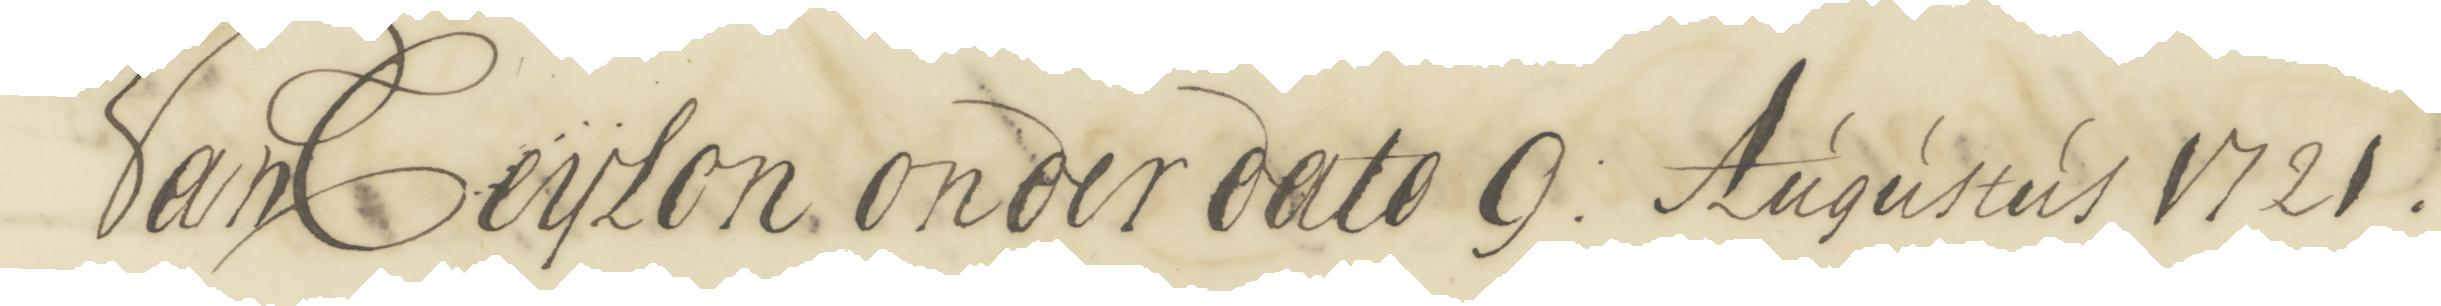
Van Ceijlon onder dato 9: Augustus 1721.
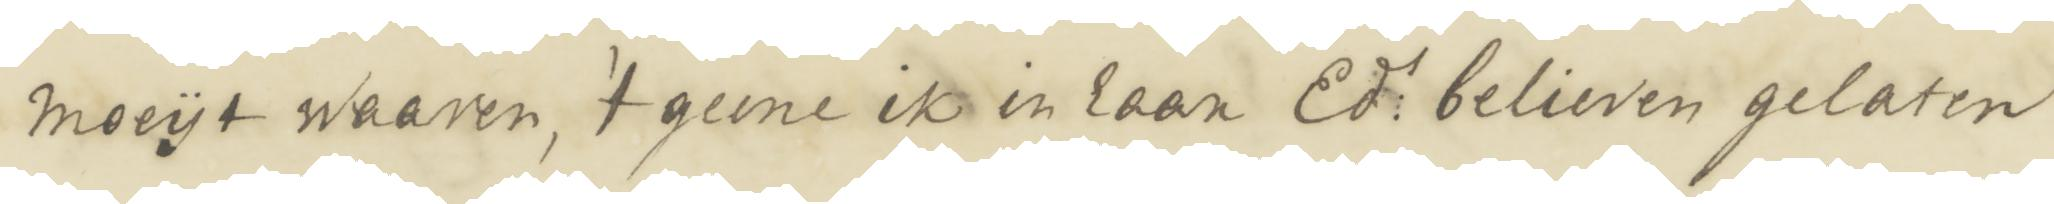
moeijt waaren, ’t geene ik in haar Ed: believen gelaten
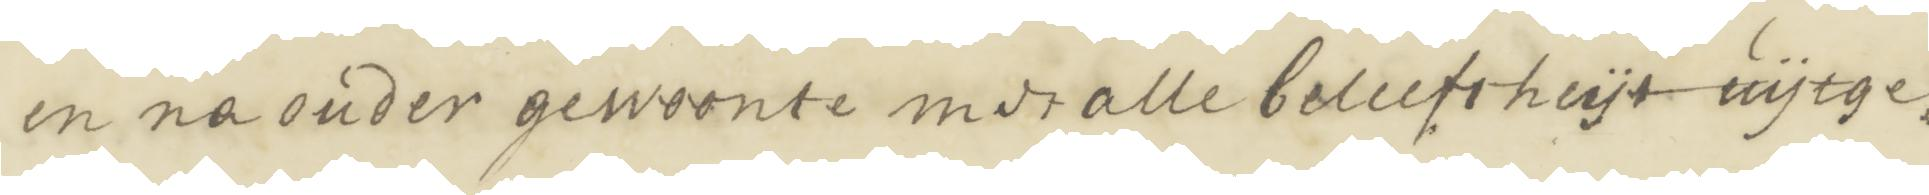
en na ouder gewoonte met alle beleeftheijt uijtge„
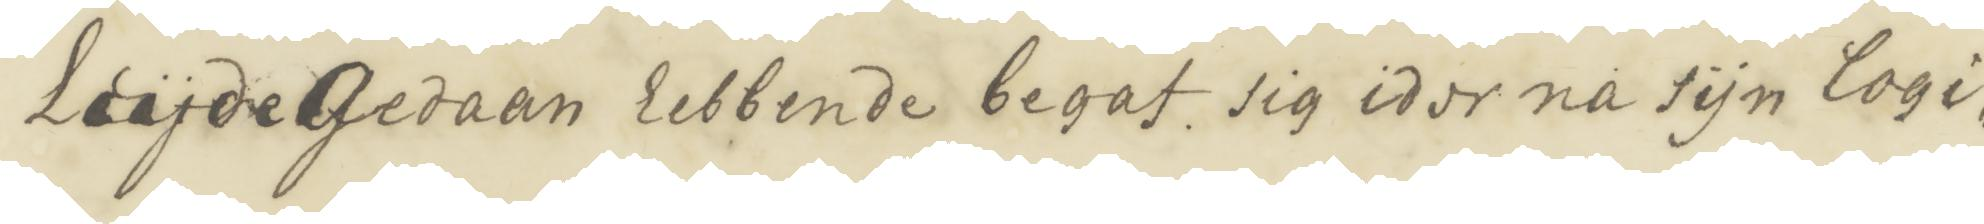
leijde gedaan hebbende begaf sig ider na sijn logi„
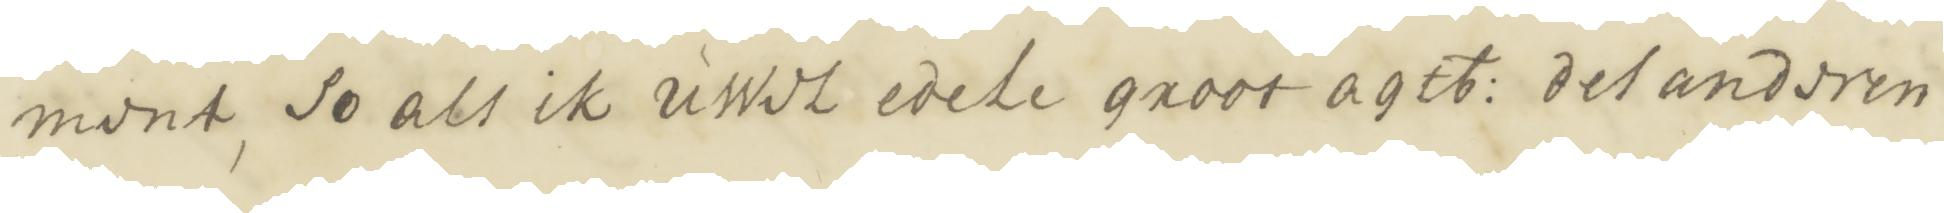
ment, so als ik uwel edele groot agtb: des anderen
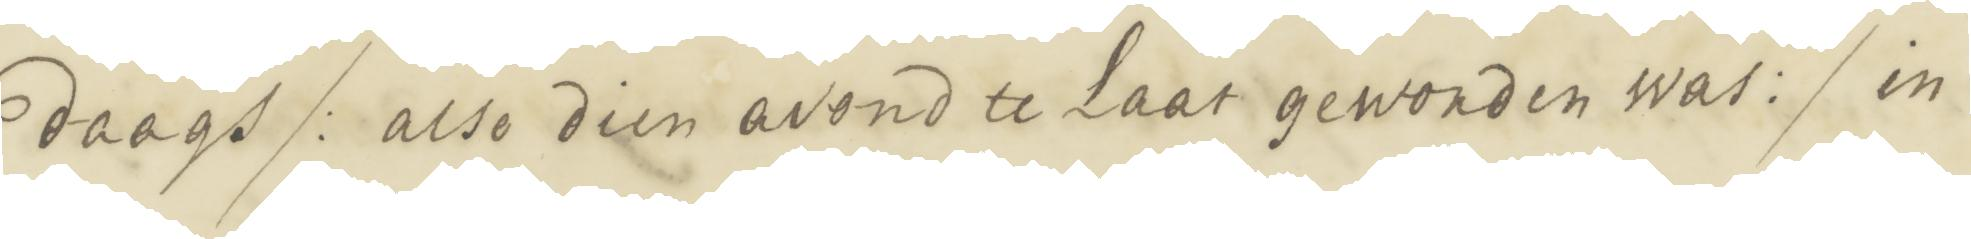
daags /: also dien avond te Laat geworden was: / in
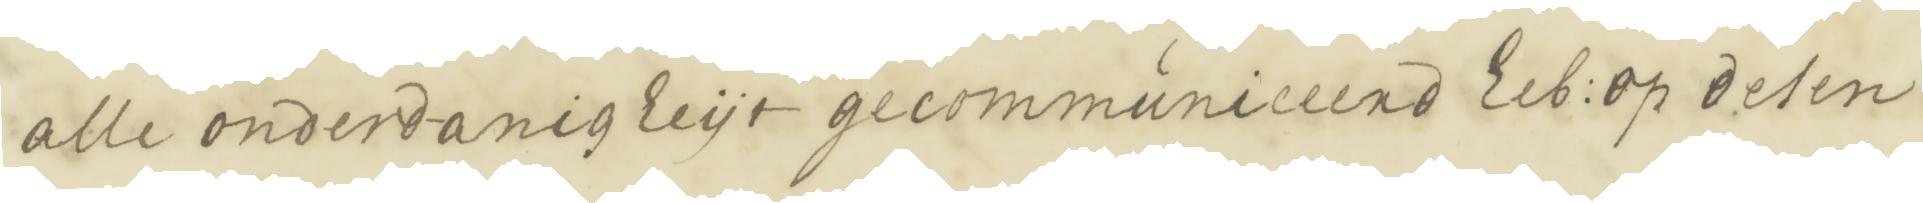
alle onderdanigheijt gecommuniceerd heb: op desen
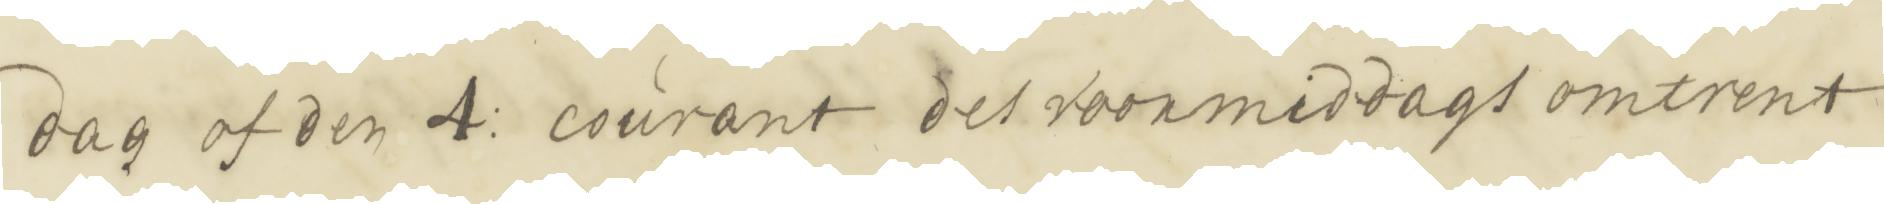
dag of den 4: courant des voormiddags omtrent
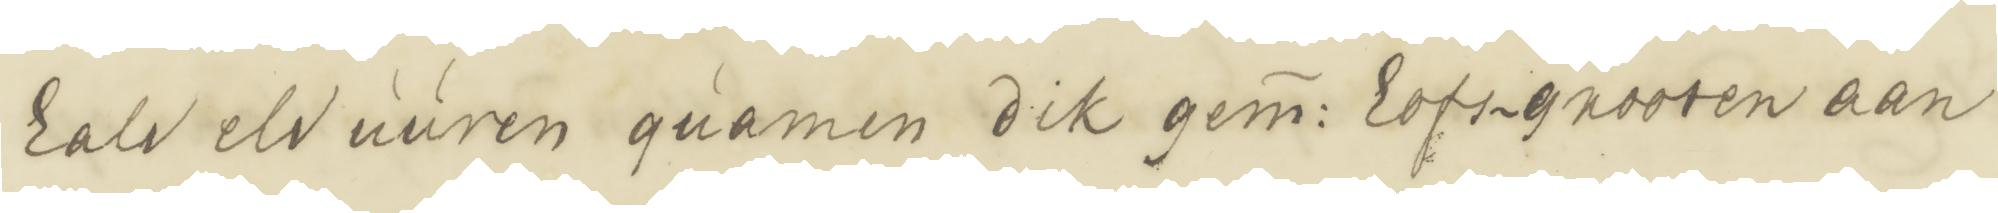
halv elv uuren quamen dik gem: hofs-grooten aan
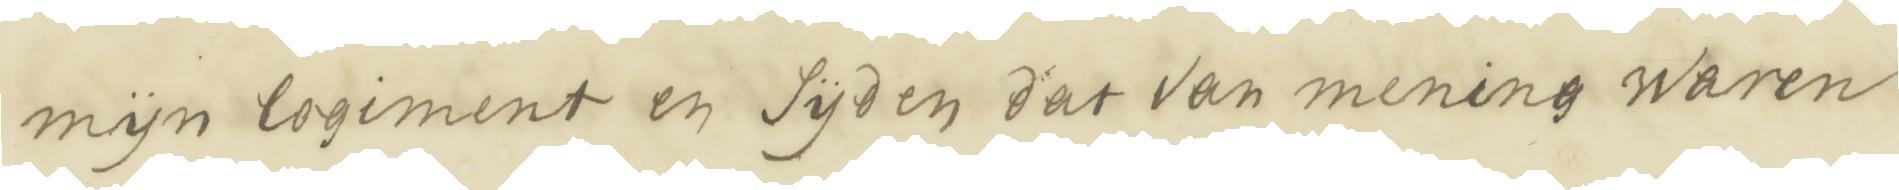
mijn logiment en sijden dat van mening waren
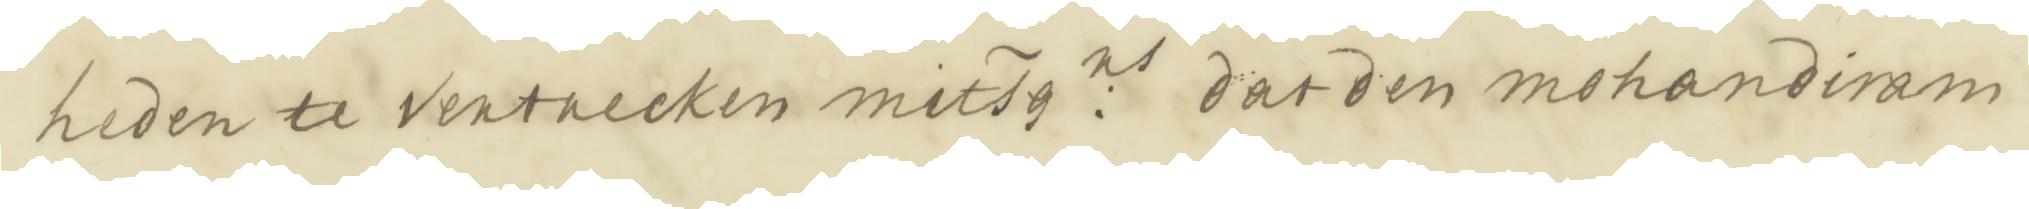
heden te vertrecken mitsg:rs dat den mohandiram
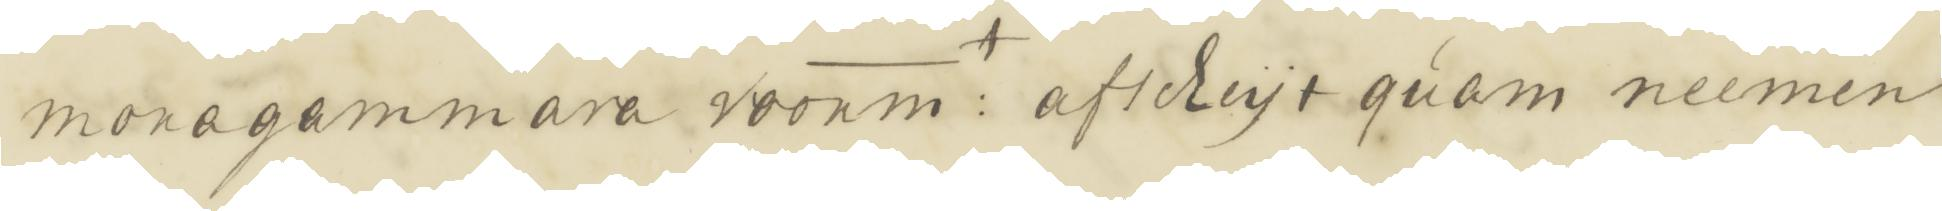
moragammara voorm:t afscheijt quam neemen
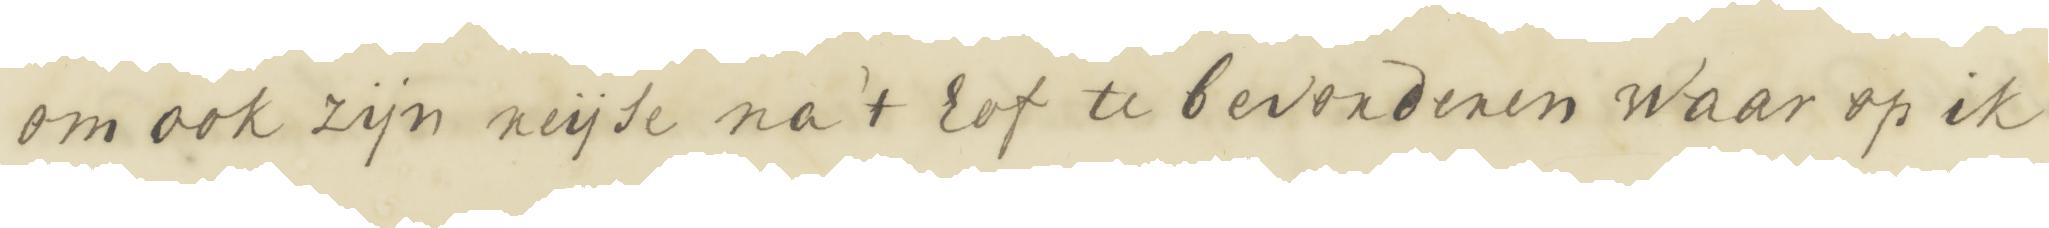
om ook zijn reijse na ’t hof te bevorderen waar op ik
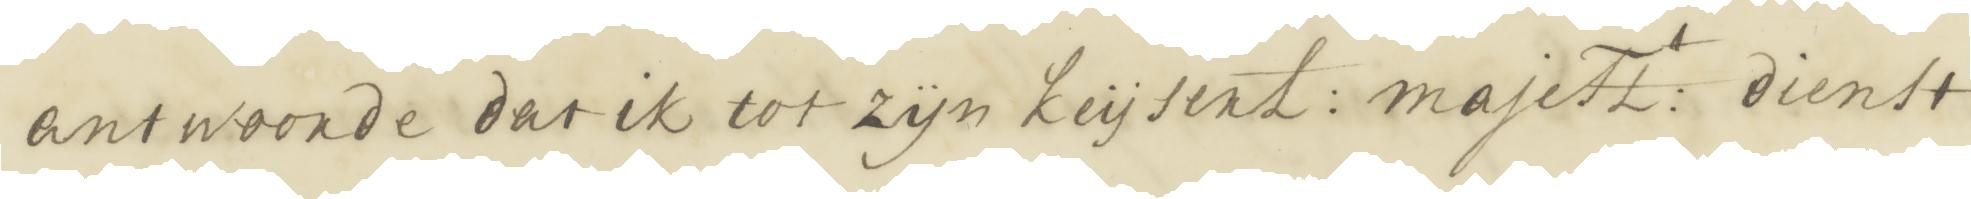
antwoorde dat ik tot zijn keijserl: majest:t dienst
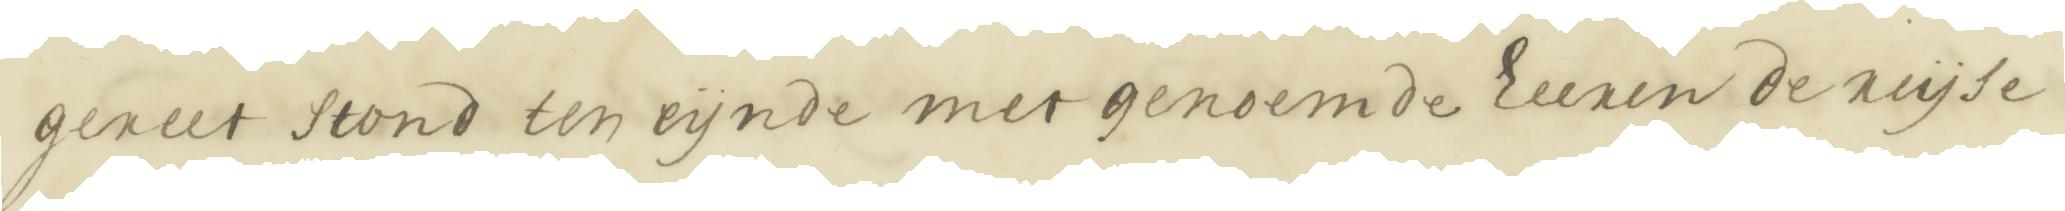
gereet stond ten eijnde met genoemde heeren de reijse
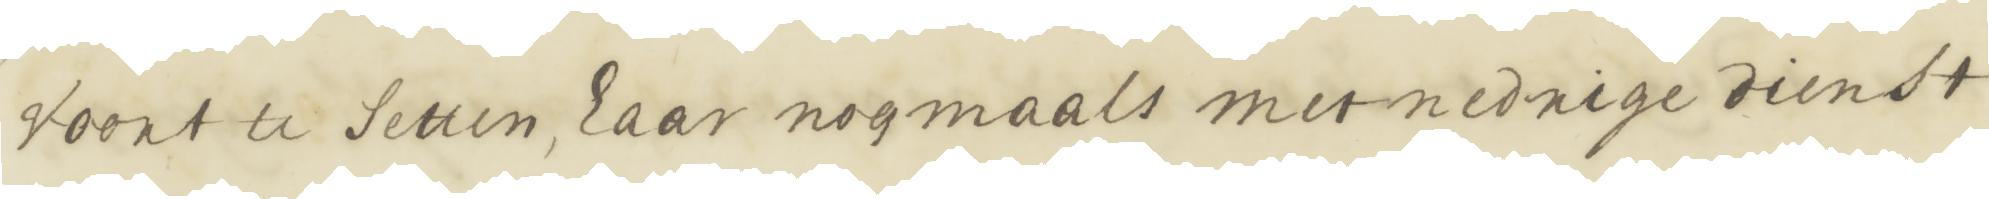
voort te setten, haar nogmaals met nedrige dienst
